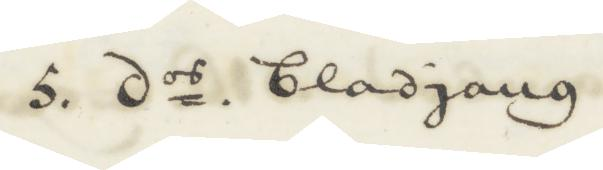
5. d=os. bladjang
